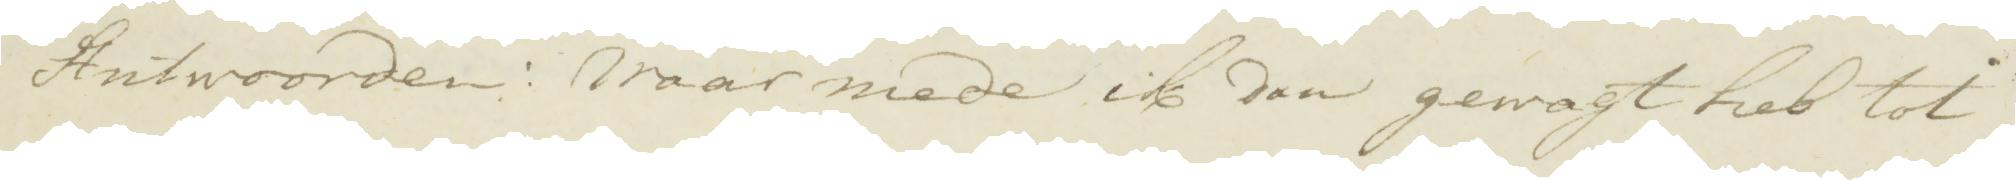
Antwoorden: waar mede ik dan gewagt heb tot
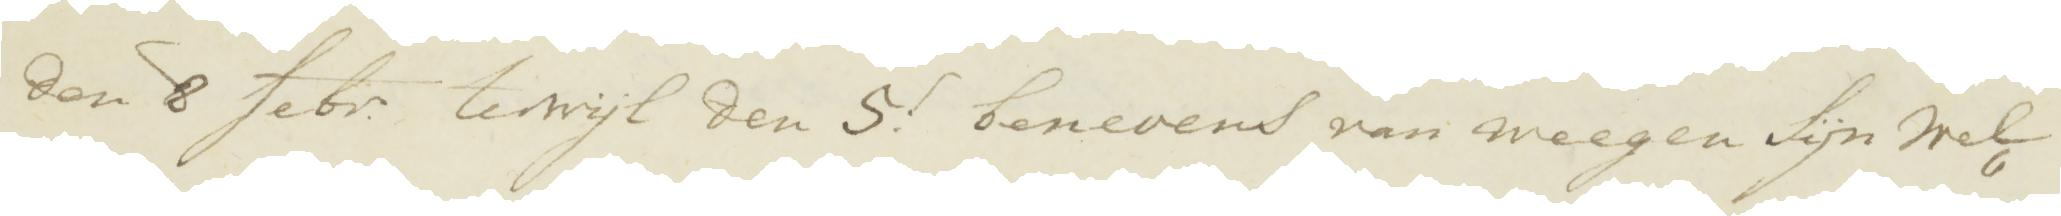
den 8 febr: tewijl den 5': benevens van weegen sijn wel
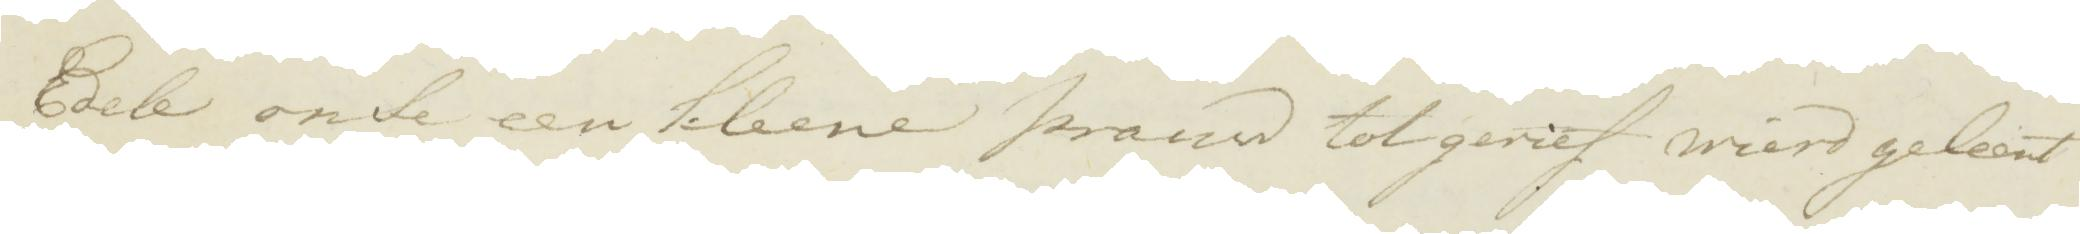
Edele onse een kleene prauw tot gerief wierd geleent
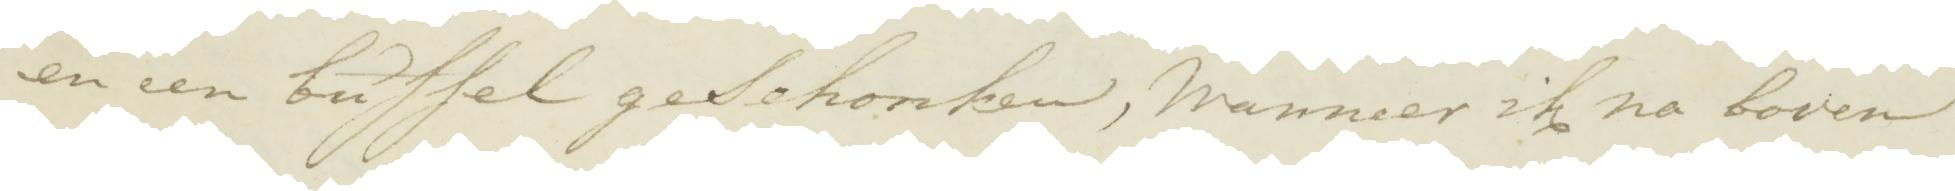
en een buffel geschonken, wanneer ik na boven
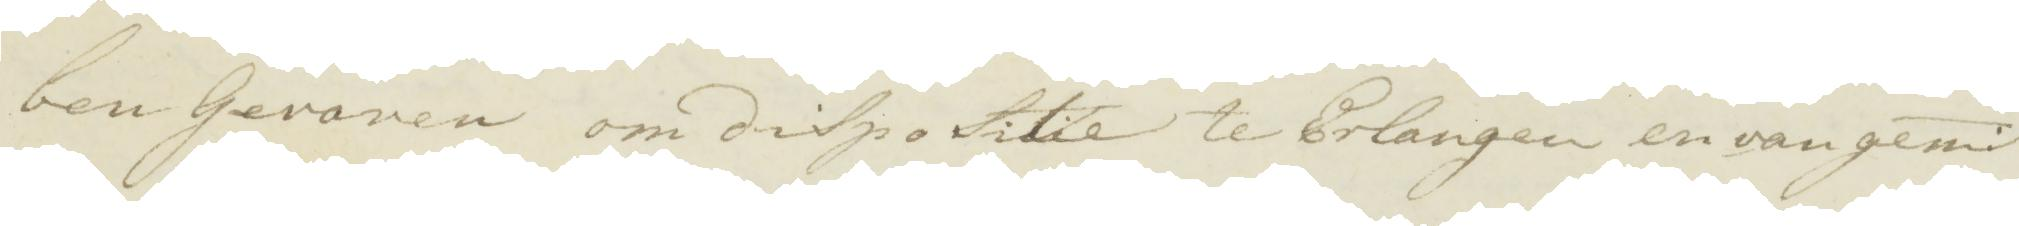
ben gevaren om dispositie te Erlangen en van gem:
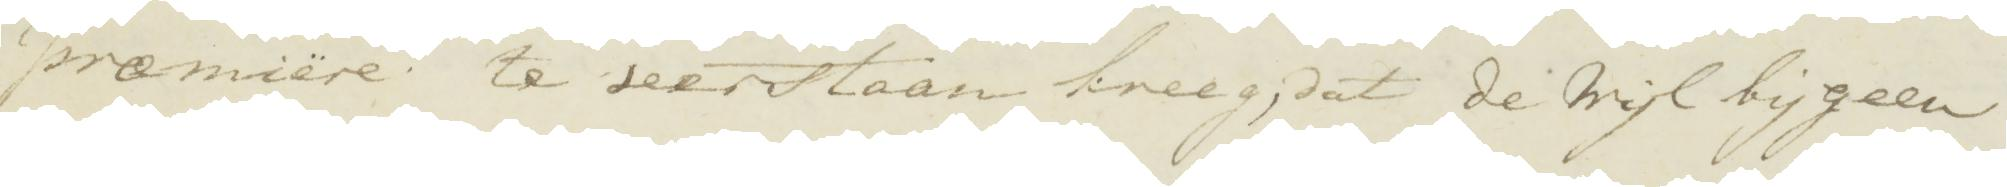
praemiëre: te verstaan kreeg, dat de wijl bij geen
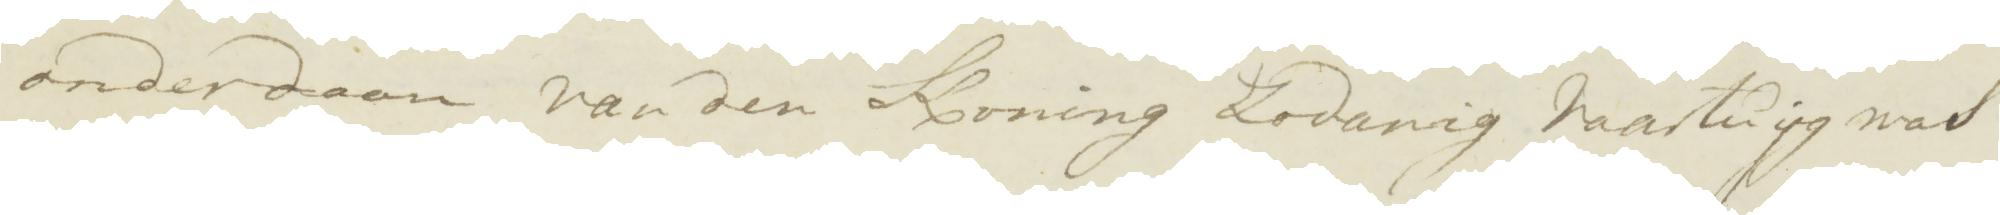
onderdaan van den Koning zodanig vaartuijg was
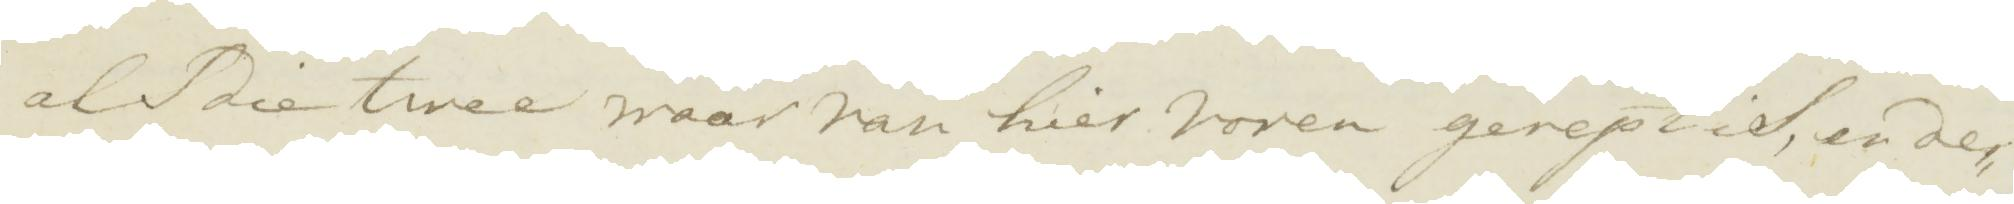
als die twee waar van hier voren gerept is, en de„
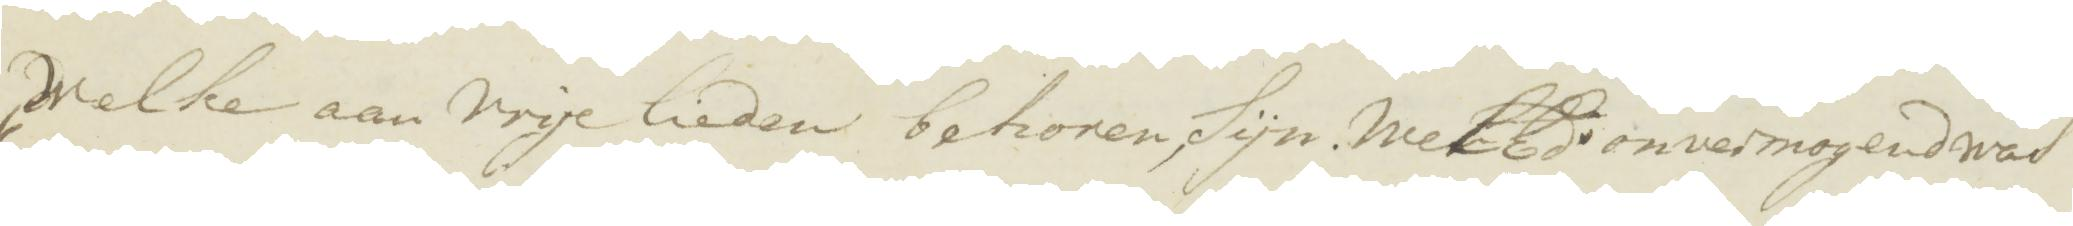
welke aan vrije lieden behoren, sijn Wel Ed.e onvermogend was
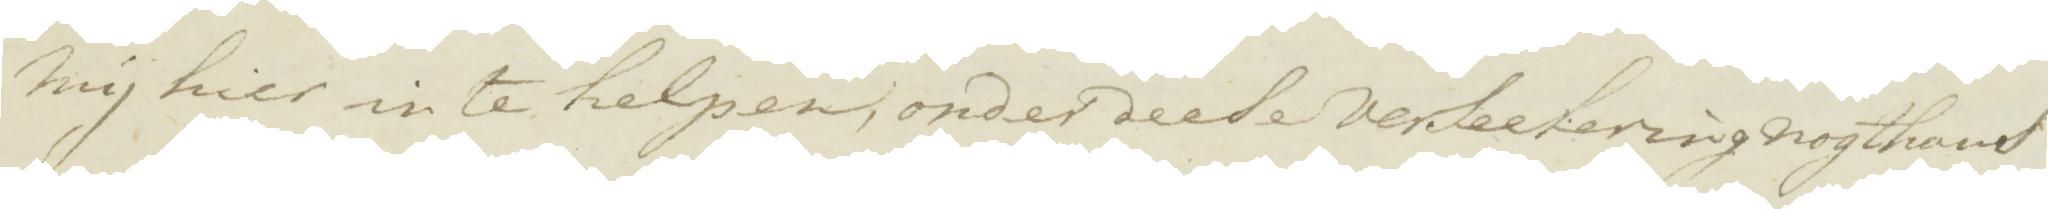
mij hier in te helpen; onder deese verseekering nogthans
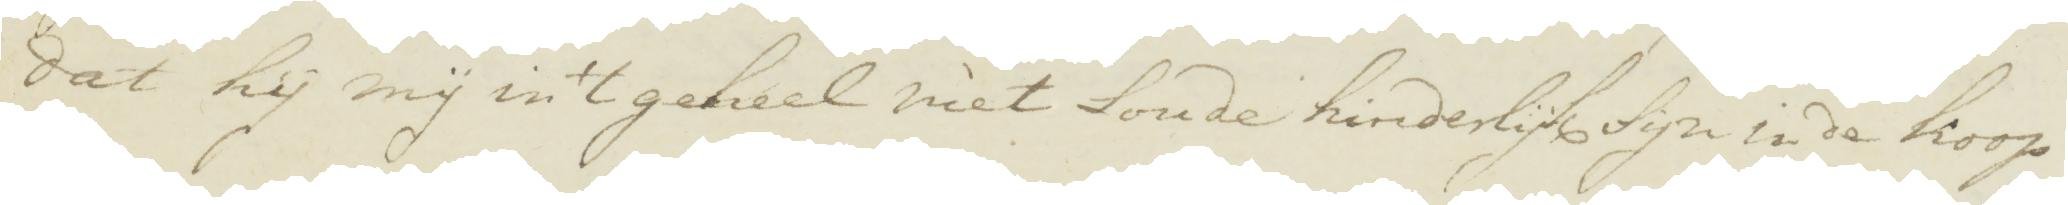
dat hij mij in ’t geheel niet soude hinderlijk sijn in de koop
